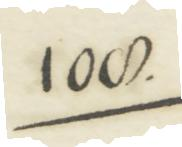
108.
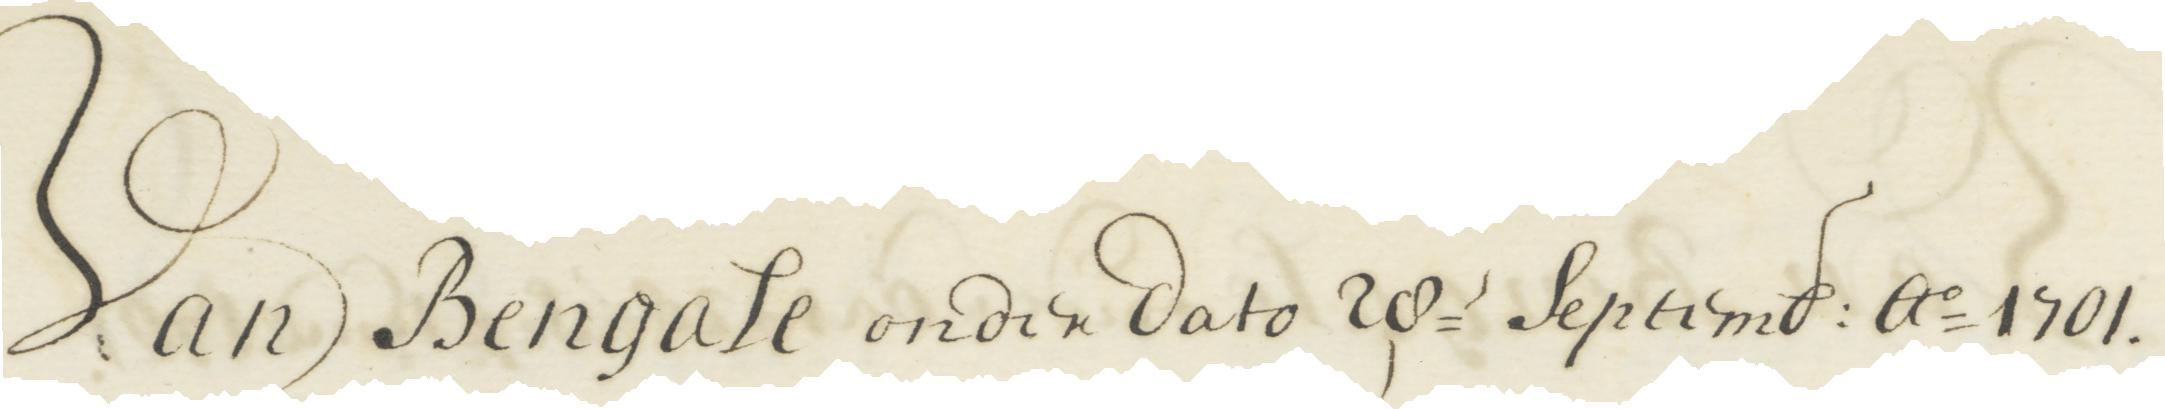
Van Bengale onder dato 28=' Septemb: a=o 1701.
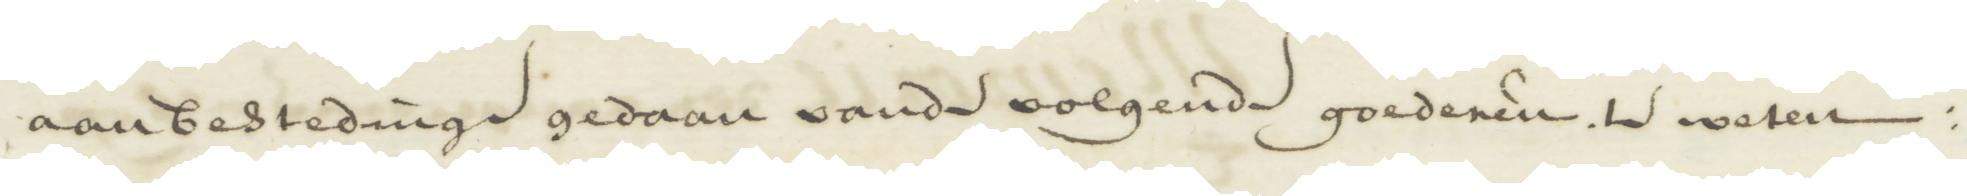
aan bestedinge gedaan vande volgende goederen, te weten
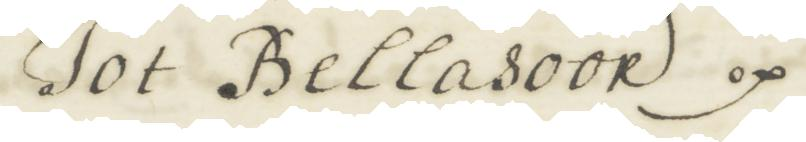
Tot Bellasoor op
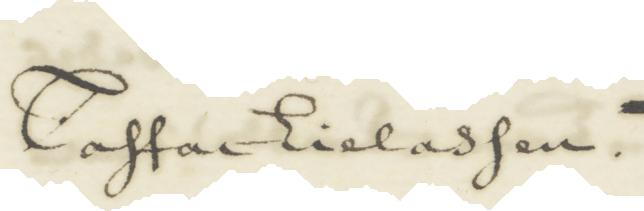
Tasfachielassen.
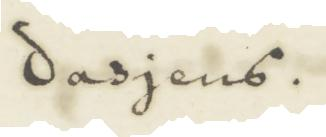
dasjens.
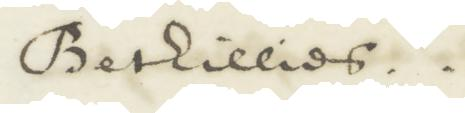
Bethillies. .
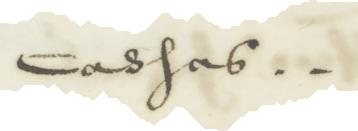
Cassas. .
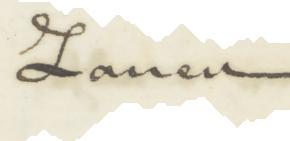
Zanen
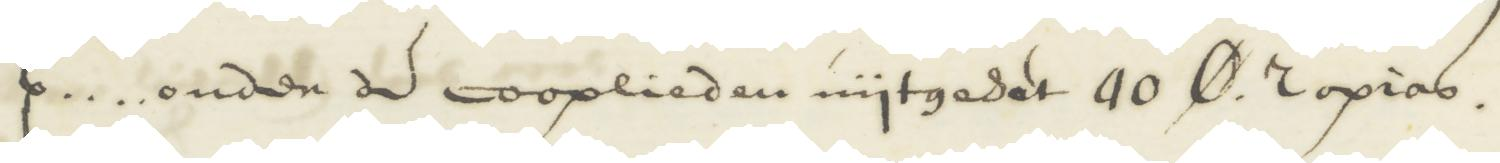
onder de cooplieden uijtgeset 40 Ø Ropias.
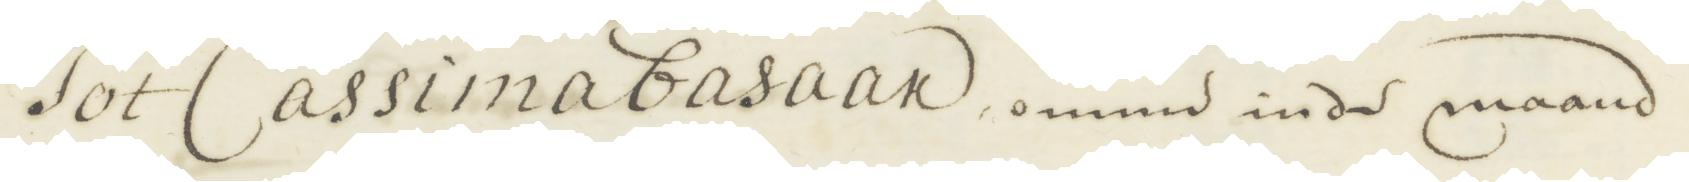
Tot Cassimabasaar, omme in de maand
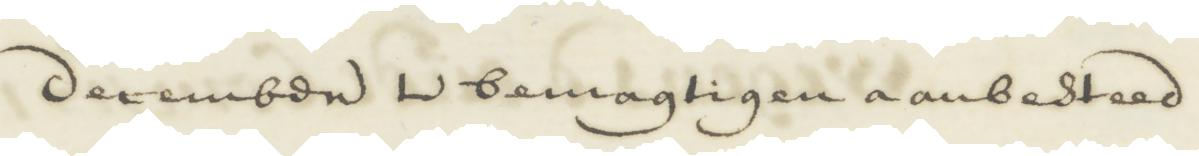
december te bemagtigen aanbesteed
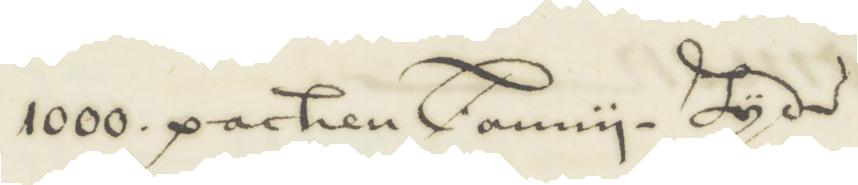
1000. packen Tannij-zijde
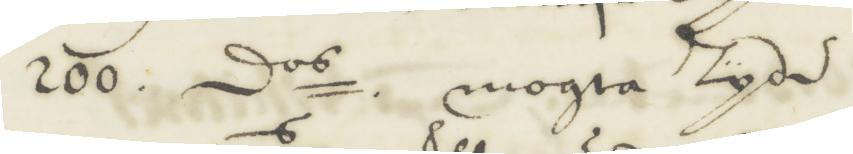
200. D=os. mogta zijde
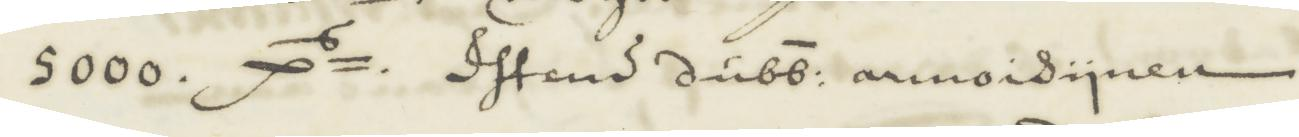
5000. p=s Effene dubb: armoisijnen
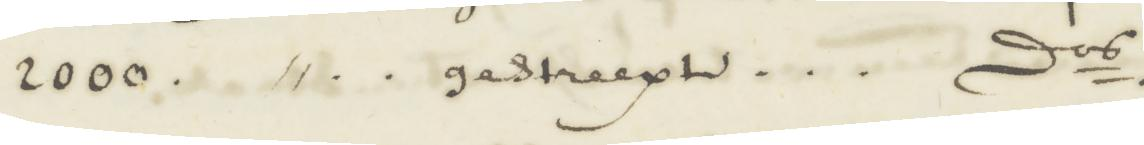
2000. „ . . gestreepte . . . D=os
